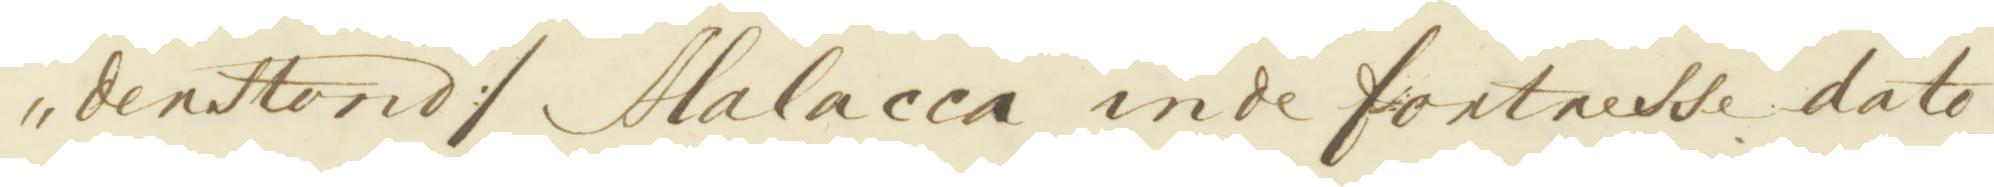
„der stond :/ Malacca in de fortresse dato
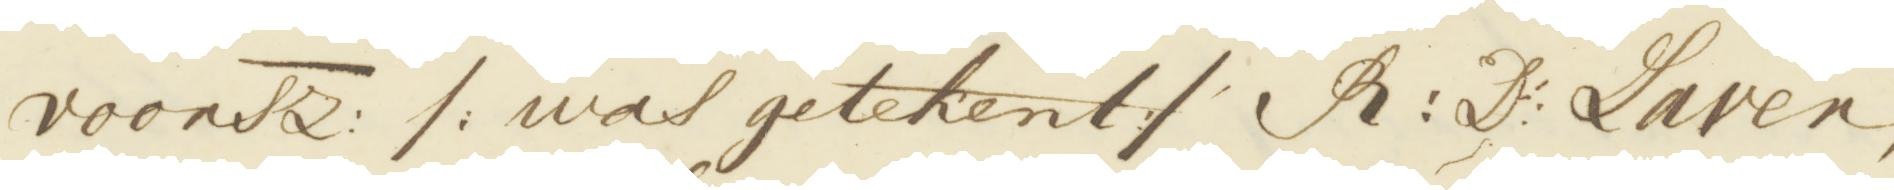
voorsz: /: was getekent :/ R: D: Laver,
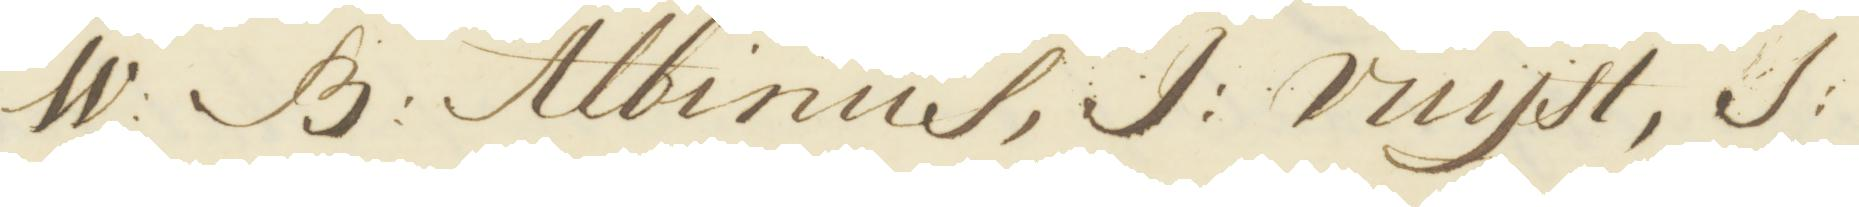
W: B: Albinus, I: vuijst, I:
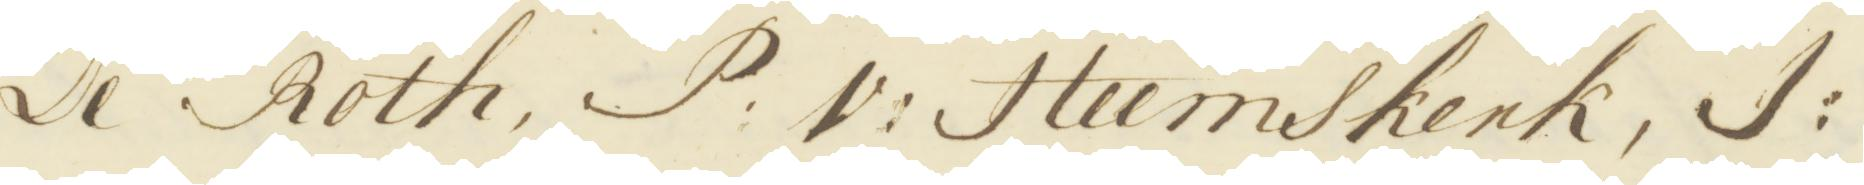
De Roth, P: V: Heemskerk, I:
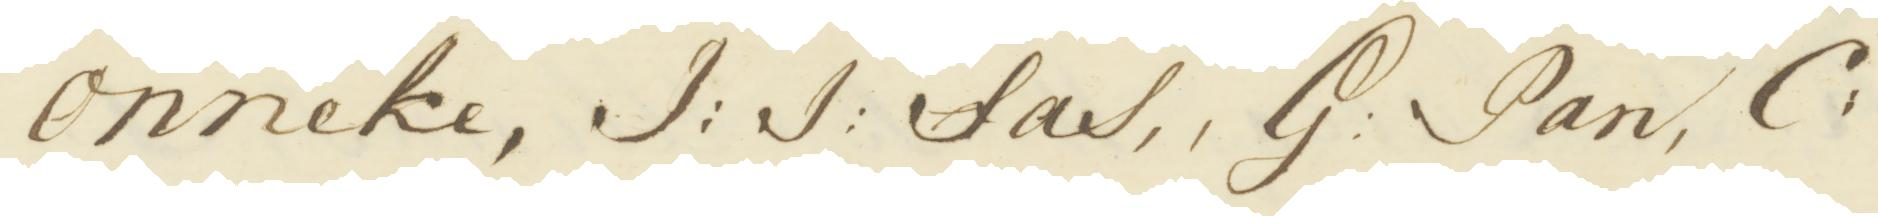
onneke, I: I: Sas,, G: Pan, C:
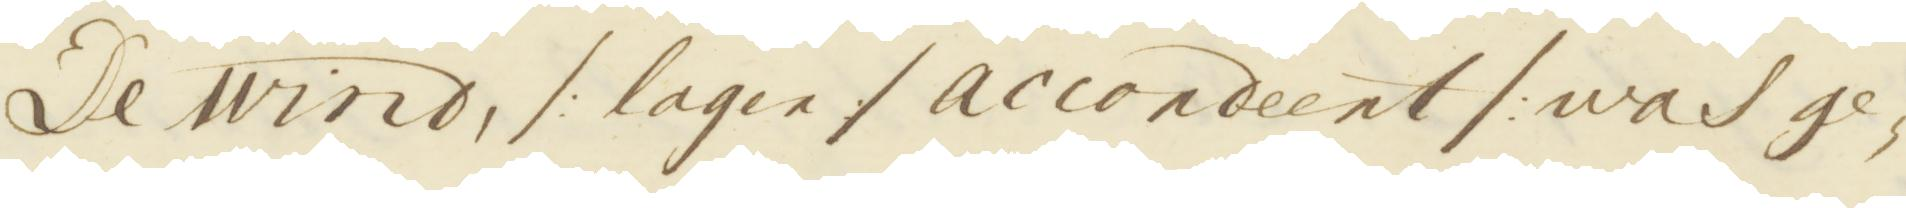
De wind, /: lager / accordeert /:was ge„
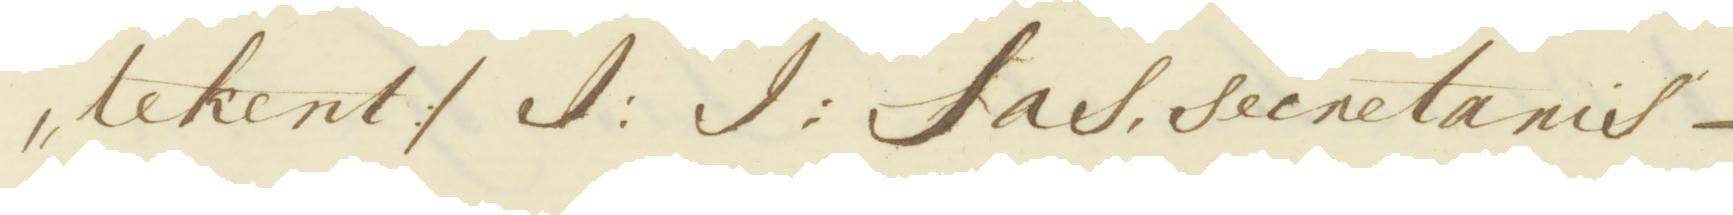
„tekent / I: I: Sas, secretaris
